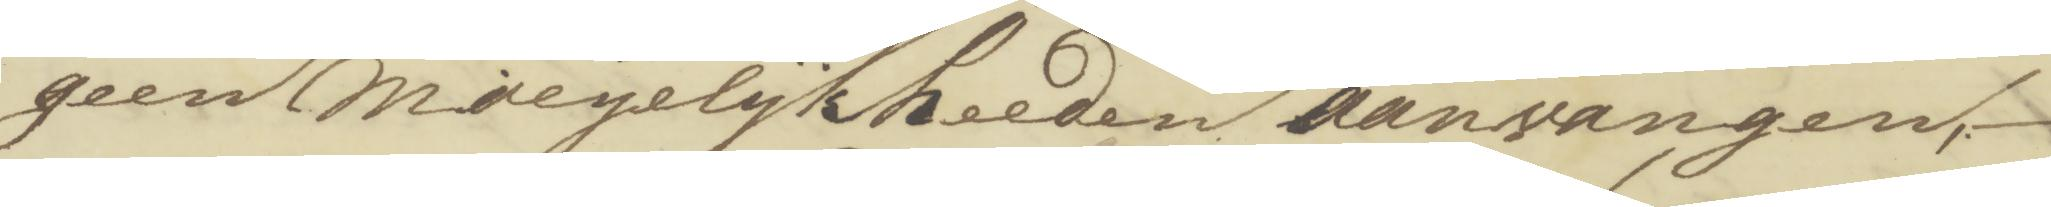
geen moeijelijkheeden aanvangen,.
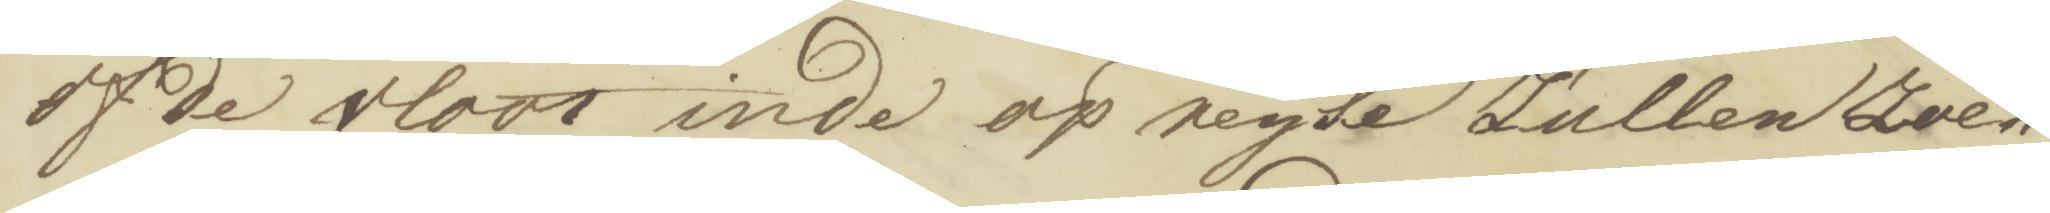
of de vloot inde op reijse zullen zoe„
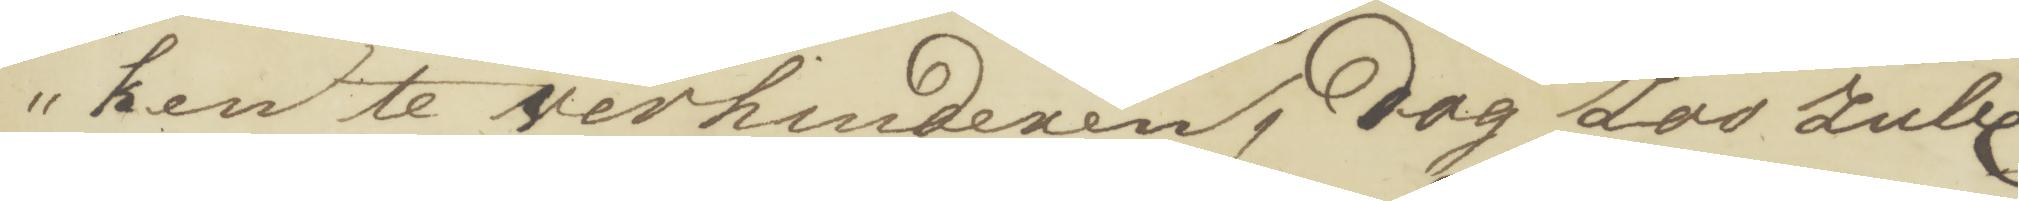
„ken te verhinderen, dog zoo zulx
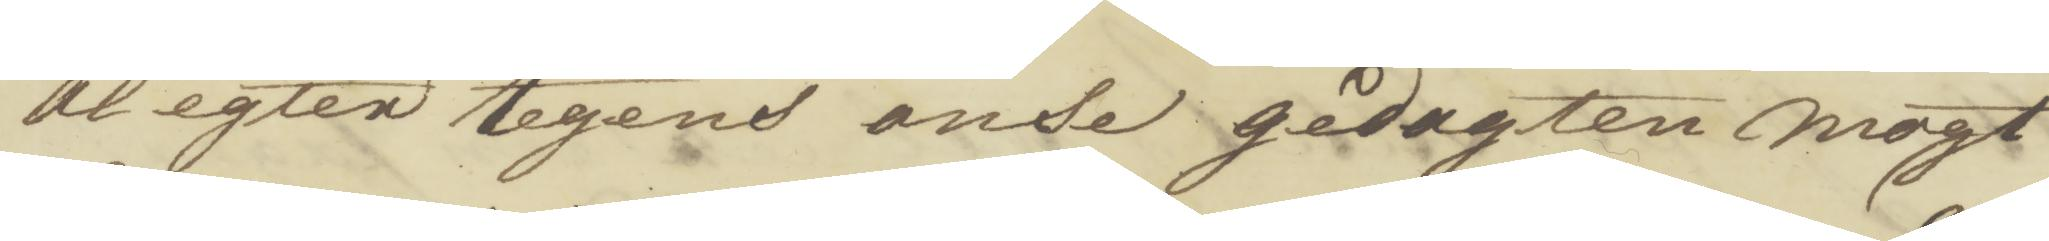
al egter tegens onse gedagten mogt
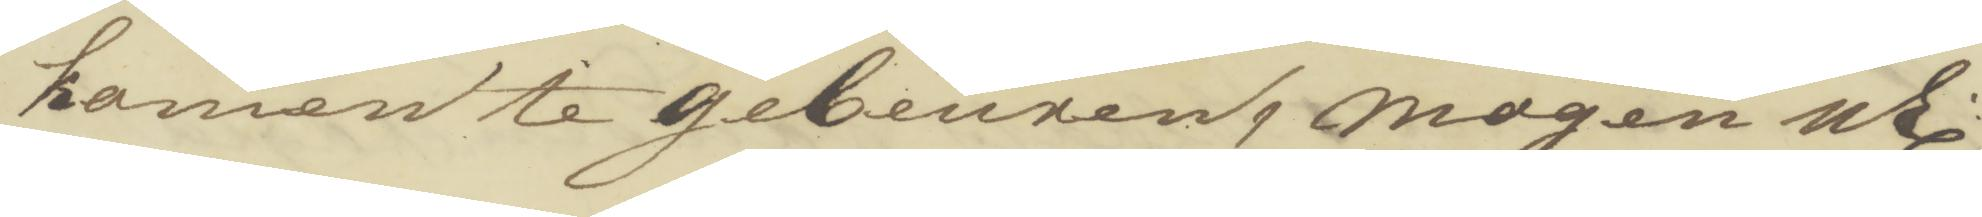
komen te gebeuren, mogen uE:
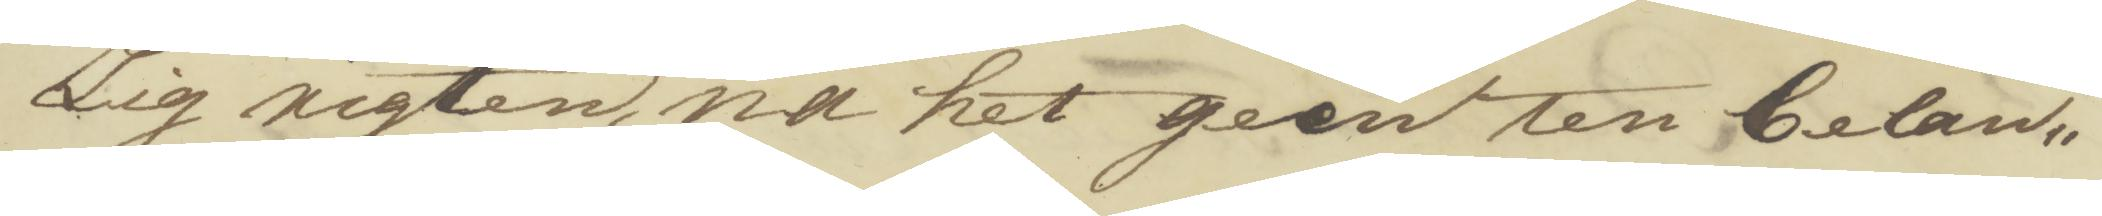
zig rigten, na het geen ten belan„
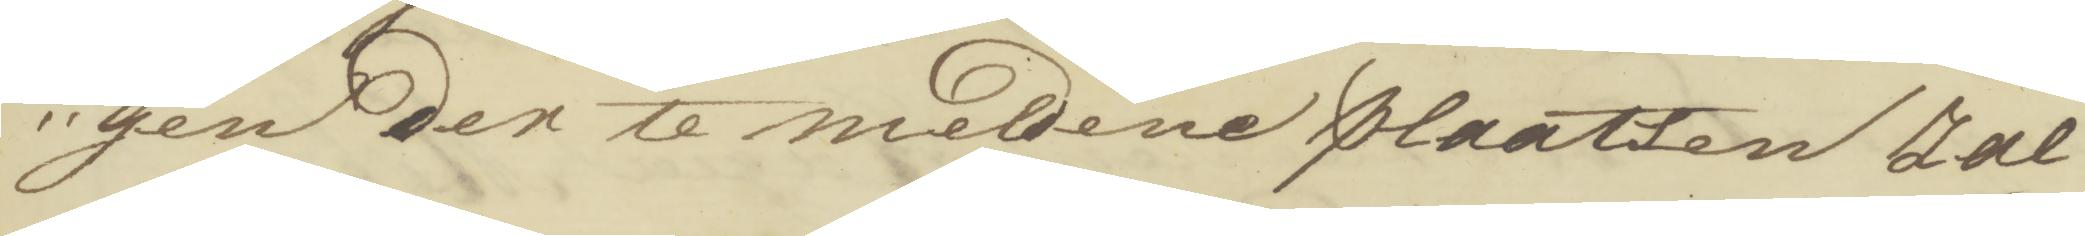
„gen der te meldene plaatsen zal
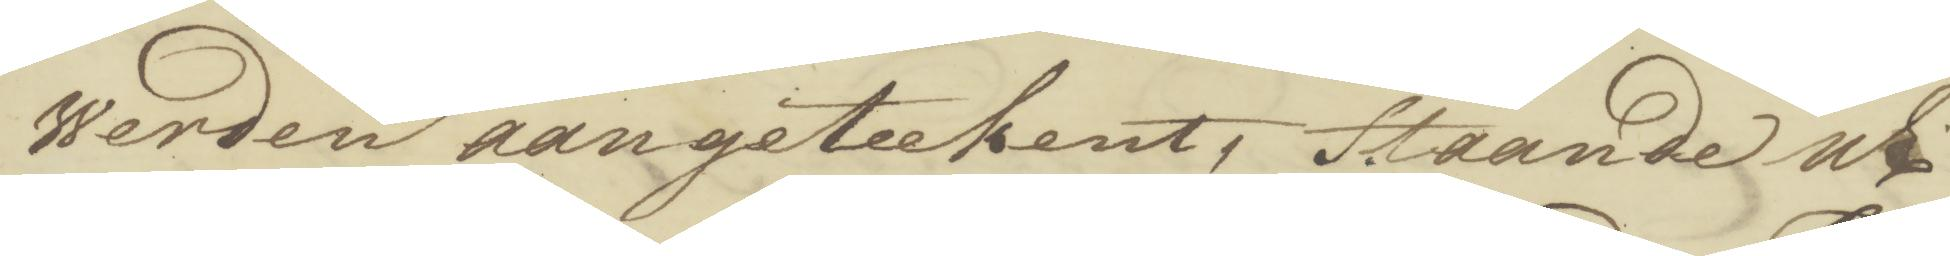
werden aangeteekent, staande uE:
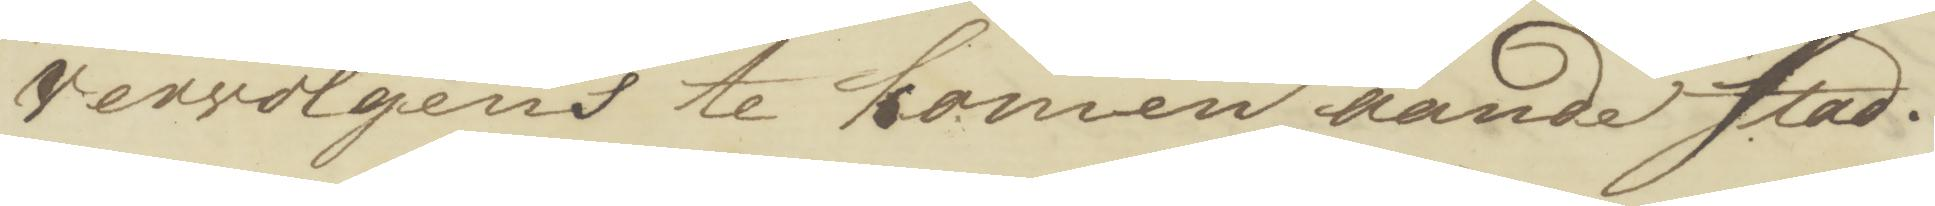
vervolgens te komen aande stad.
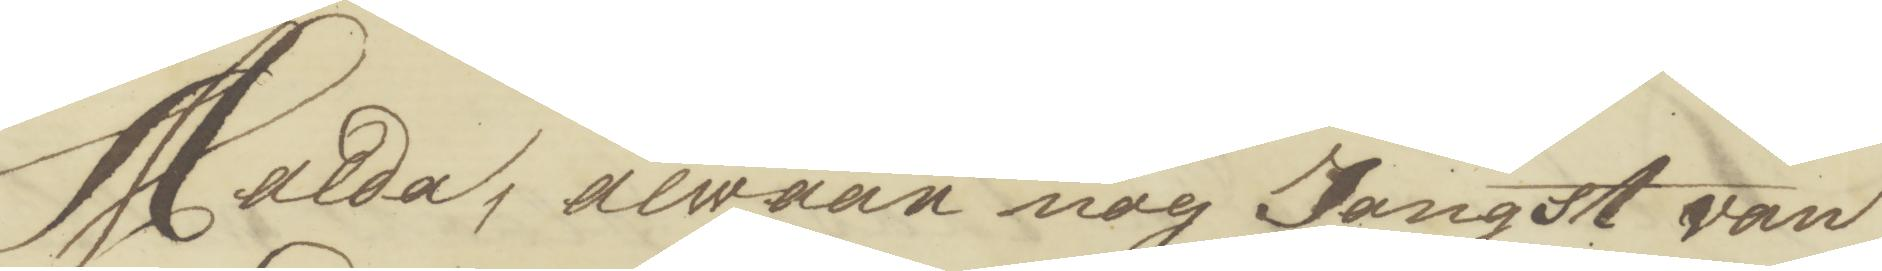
Malda, alwaar nog Iongst van
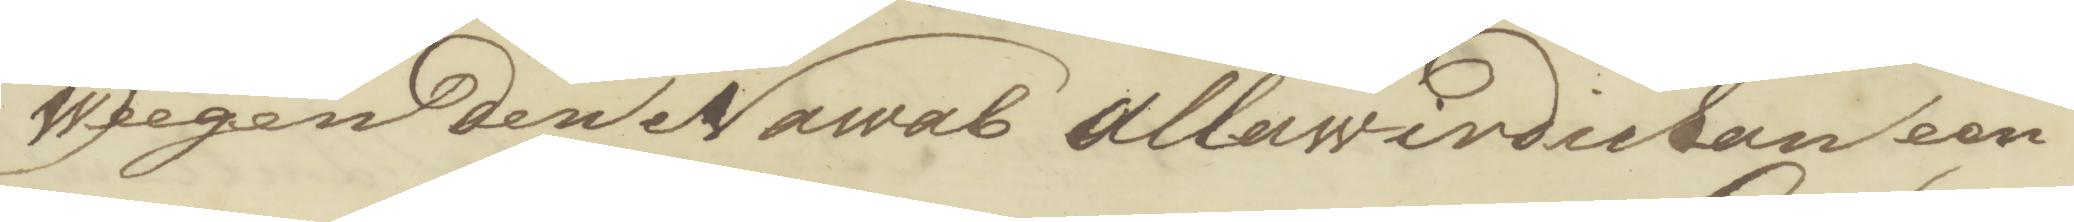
weegen den Nawab Allawerdichan een
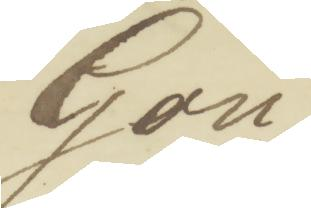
Gou
